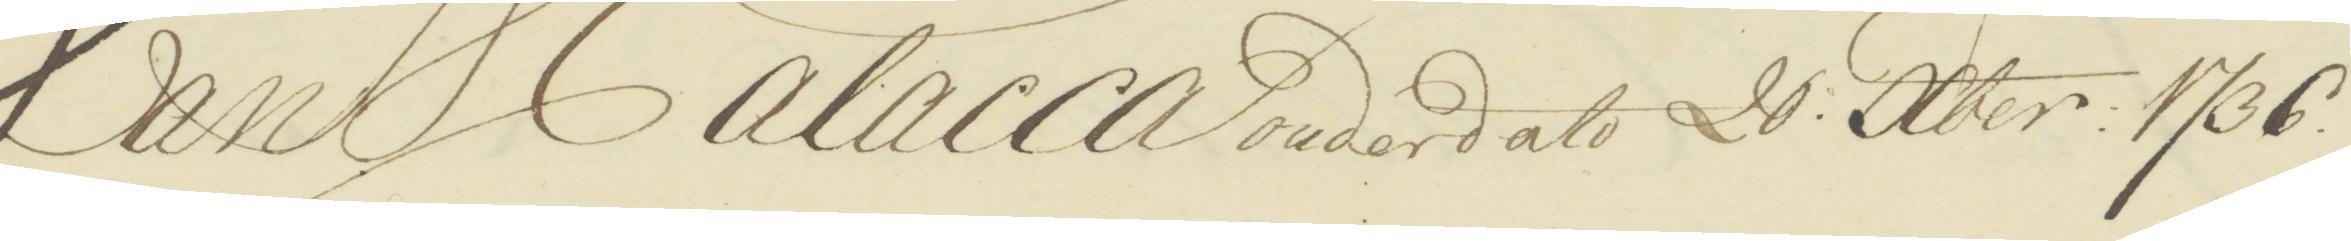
Van Malacca onder dato 20: xber: 1736.
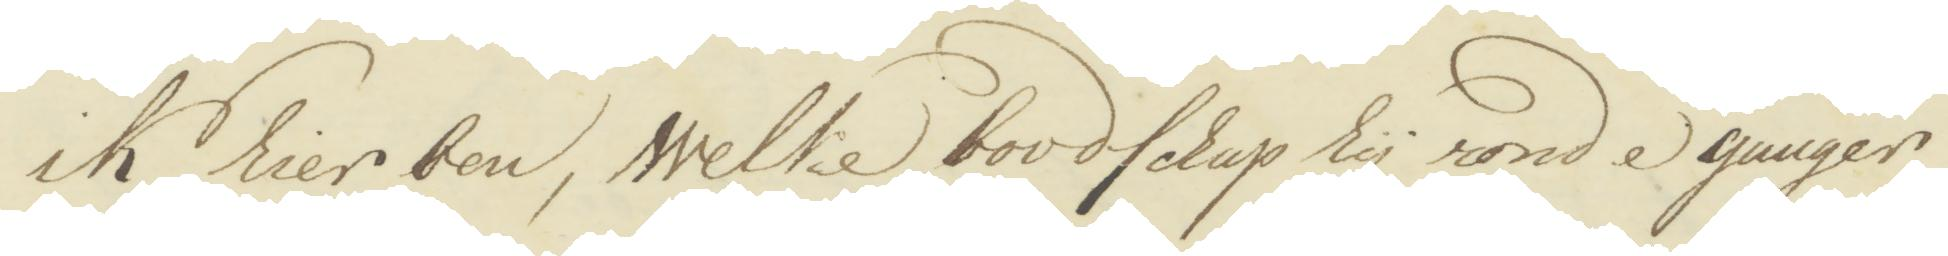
ik hier ben, welke boodschap hij rond e ganger
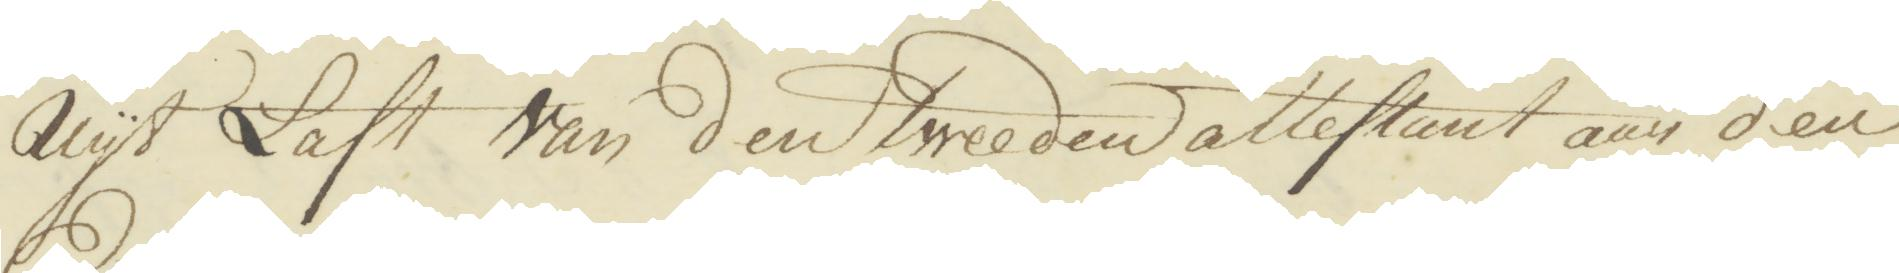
uijt Last van den tweeden attestant aan den
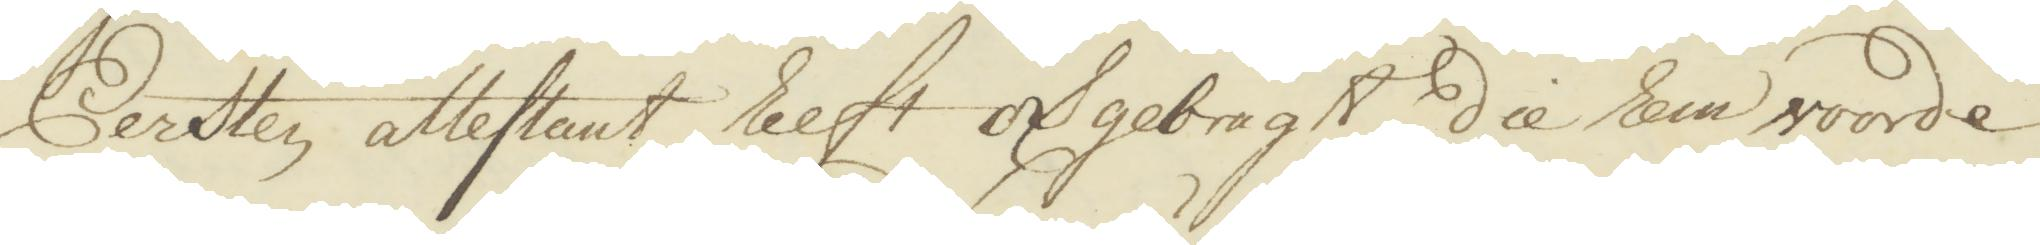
Eersten attestant heeft overgebragt, die hem voorde
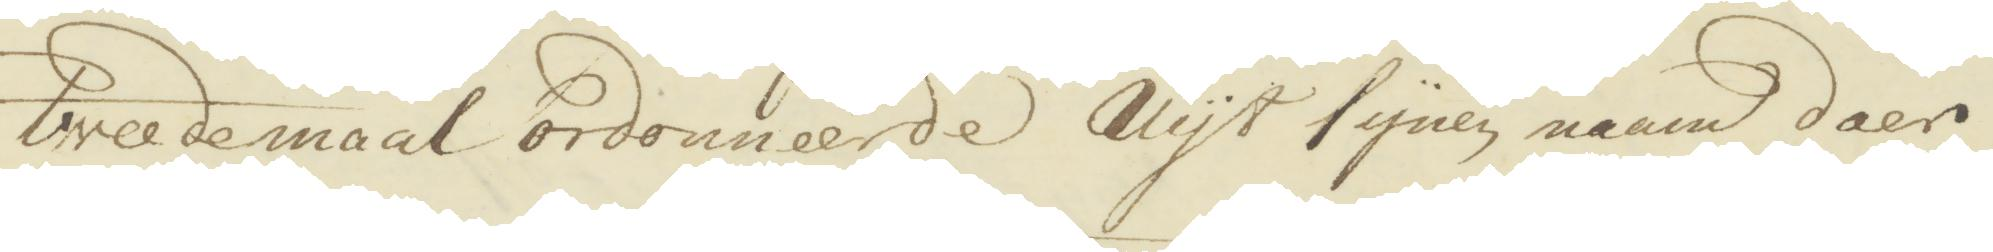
twee de maal ordonneerde uijt sijnen naam daer
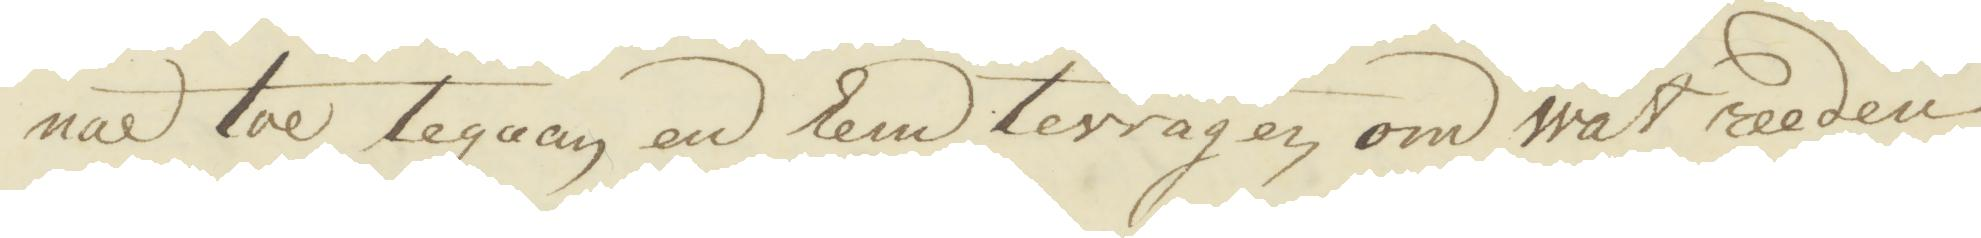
nae toe te gaan en hem te vragen om wat reeden
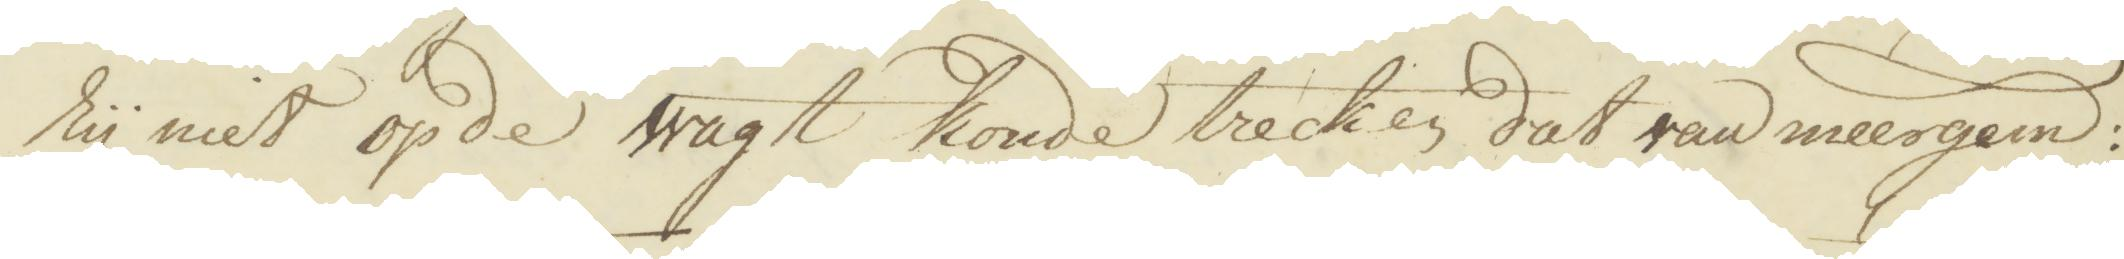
hij niet op de wagt konde trecken dat van meergem:
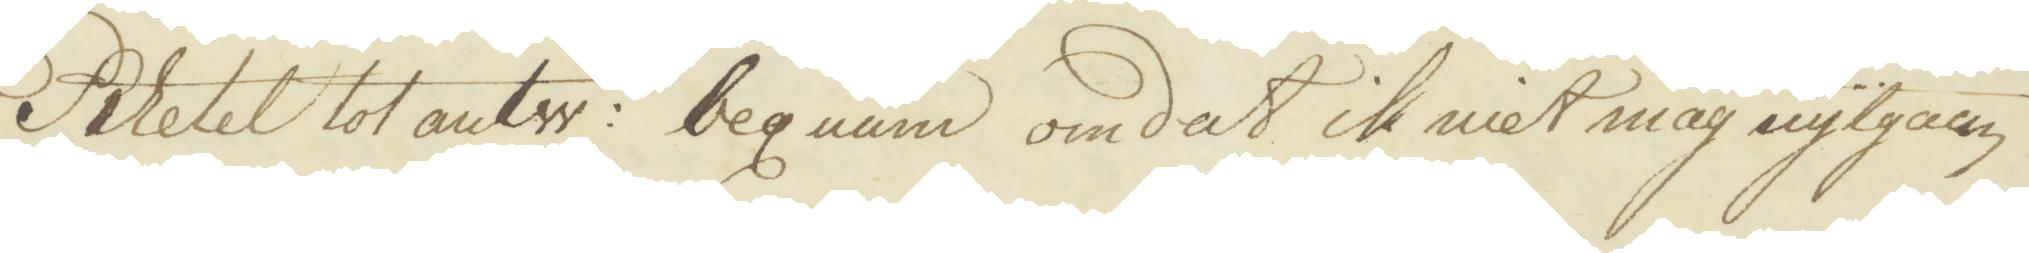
Rhetel tot antw: bequam om dat ik niet mag uijtgaan
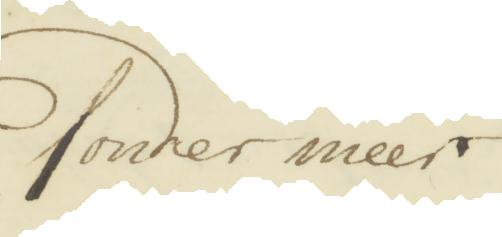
sonder meer
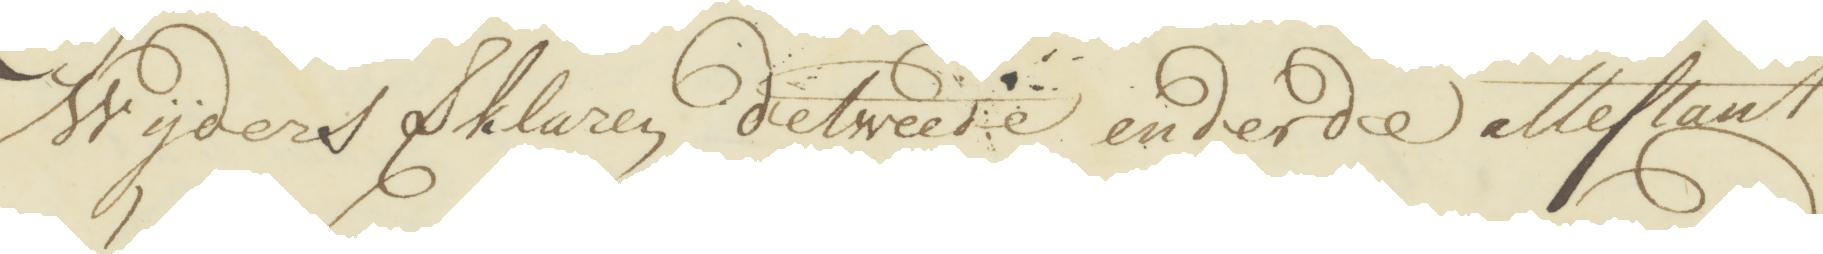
Wijders verklaren detweede en derde attestant
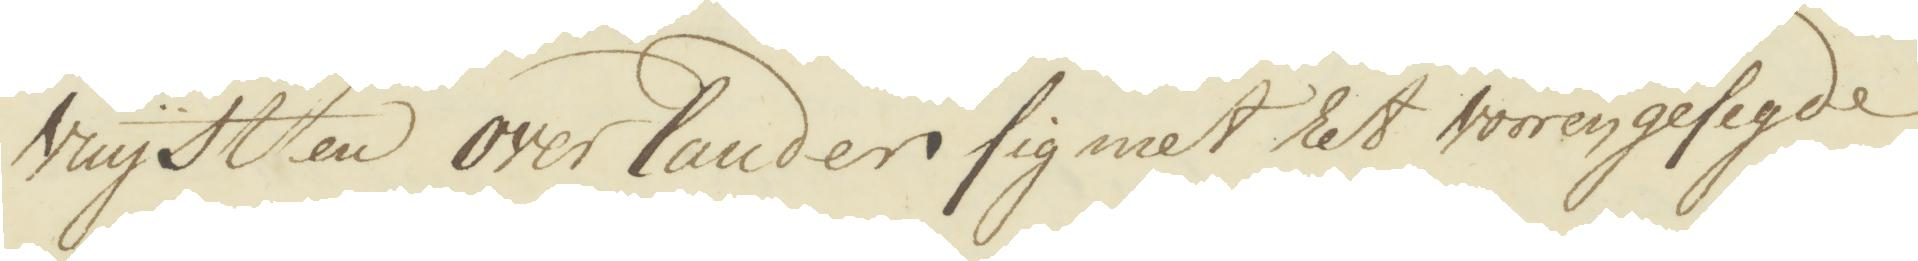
vuijst en over lander sig met het vooren gesegde
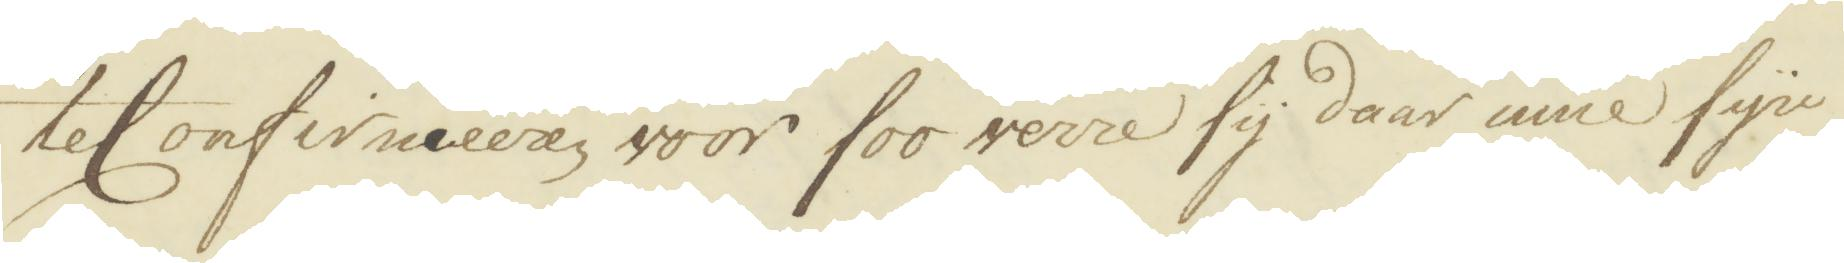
te confirmeeren voor soo verre sij daar inne sijn
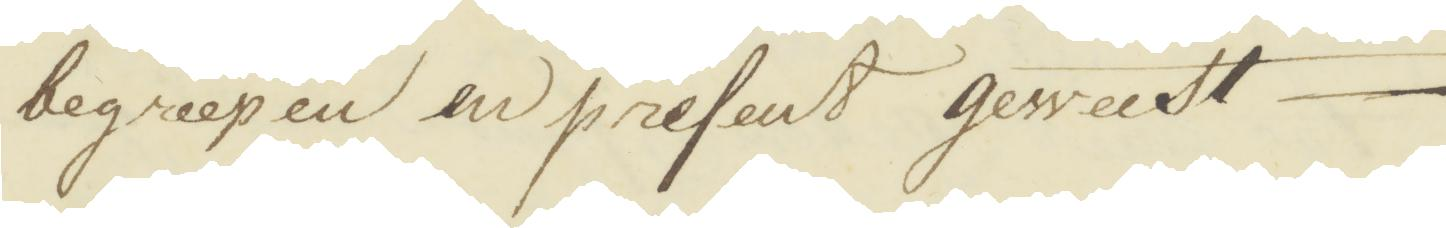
begreepen en present geweest —
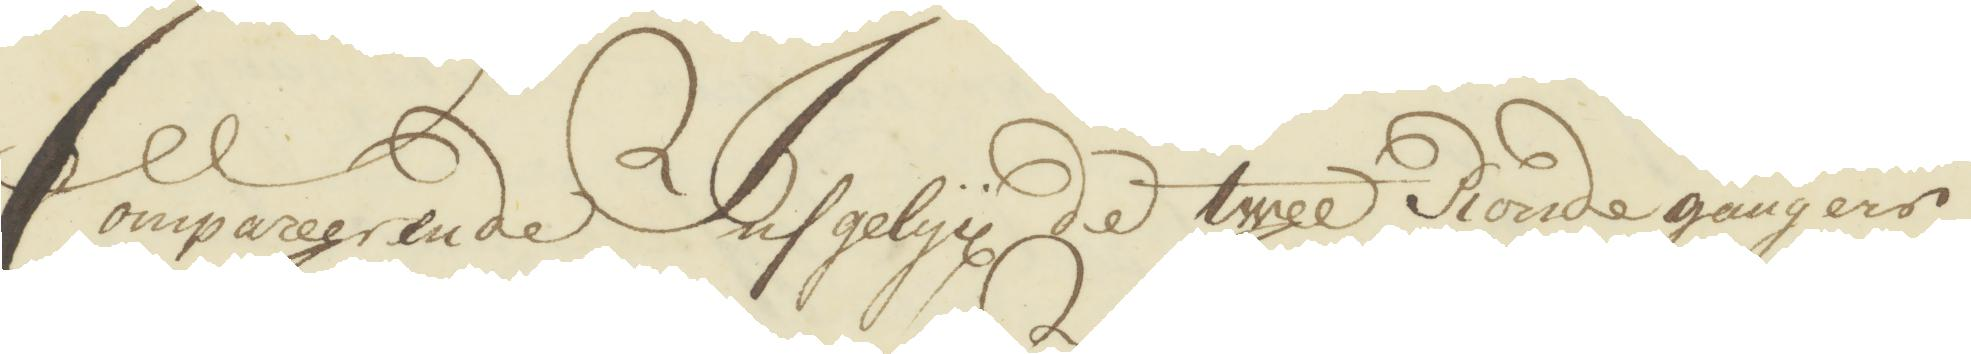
Compareerende Insgelijx de twee Rondegangers
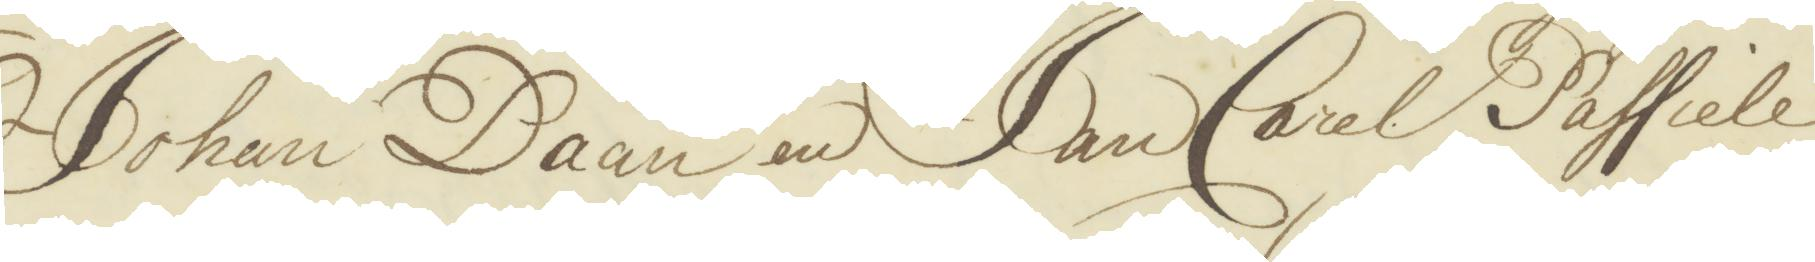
Johan Daan en Jan Carel Passiele
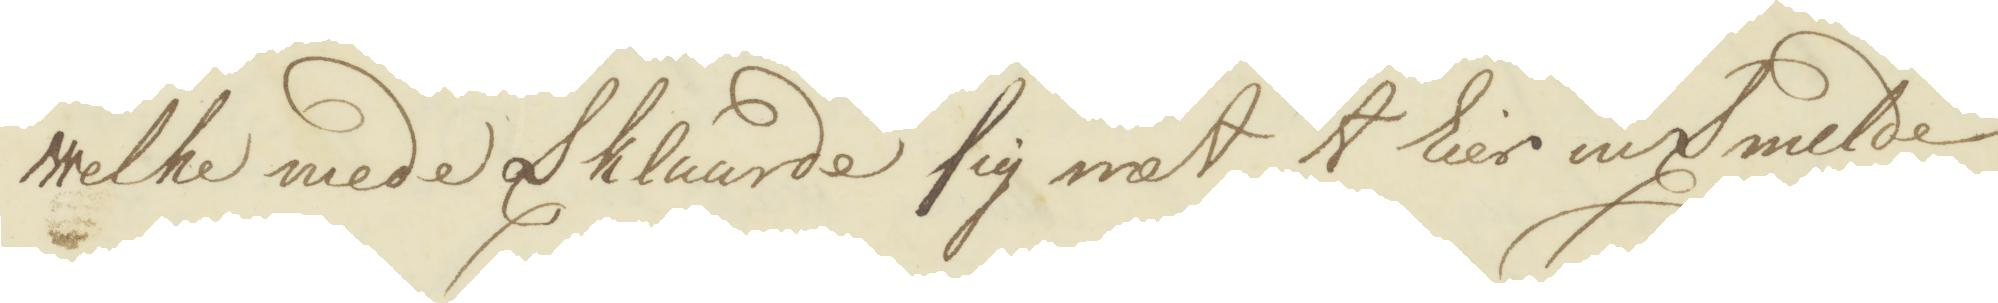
welke mede verklaarde sig met 't hier invermelde
